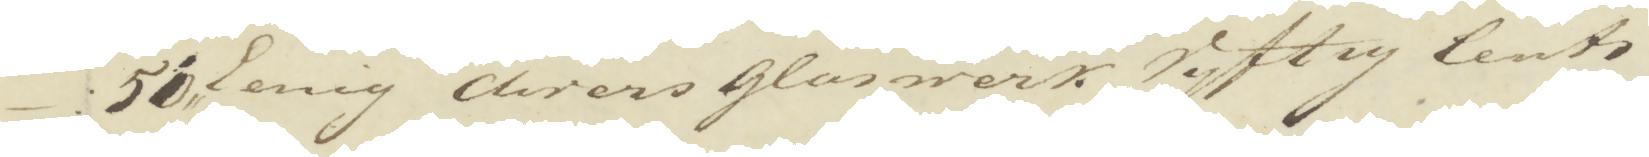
—: 50„ Eenig divers glas werk Vyftig Cents
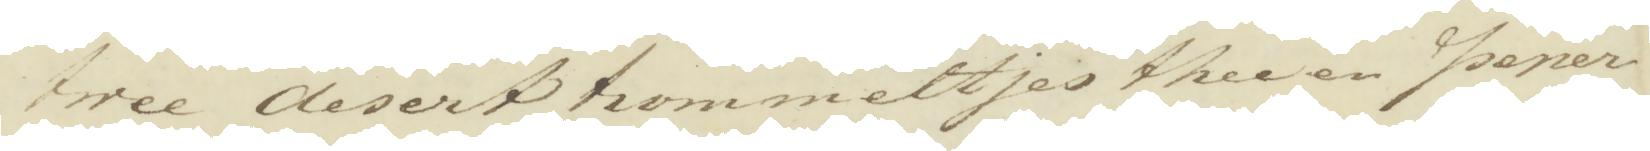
twee desert trommeltjes thee en Peper
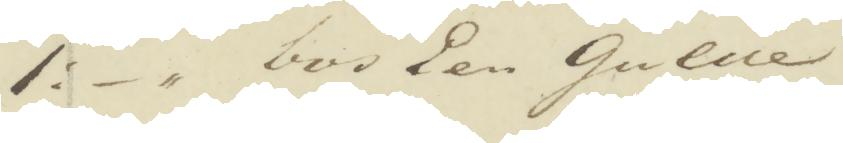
1: — „ bos Een Gulde
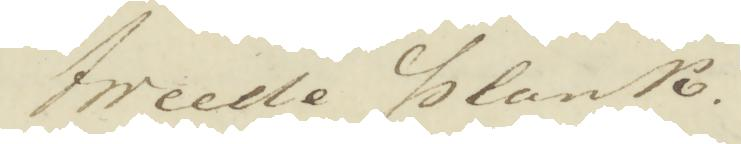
Tweede Plank.
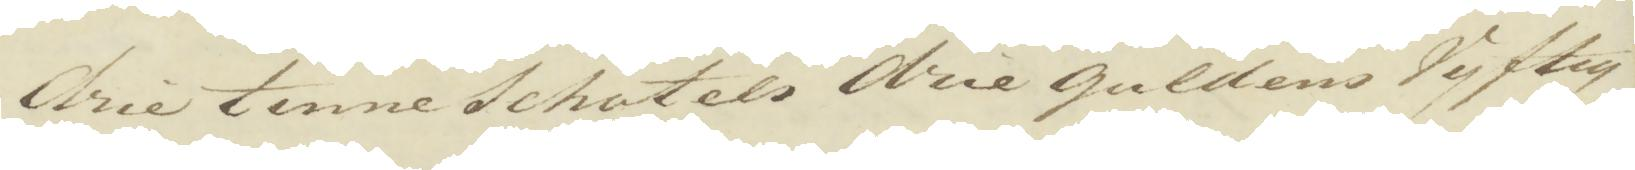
drie tinne schotels drie guldens Vyftig
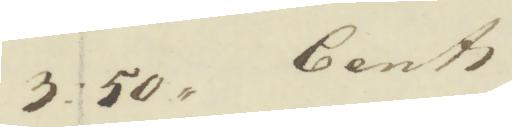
3: 50 „ Cents
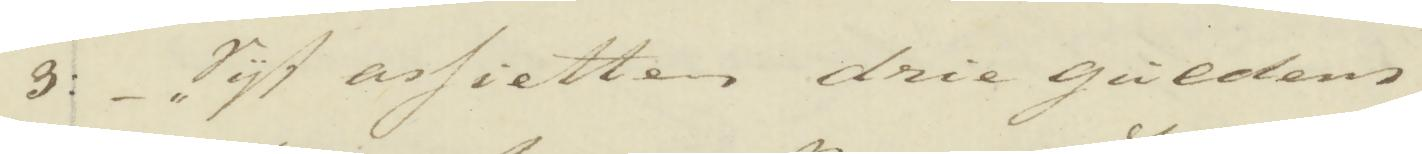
3: — „ Vijf assietten, drie guldens
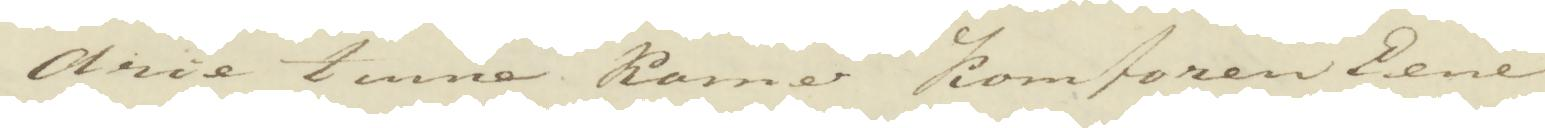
drie tinne Kamer Komforen Eene
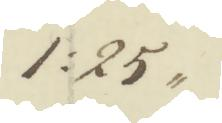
1:25 „
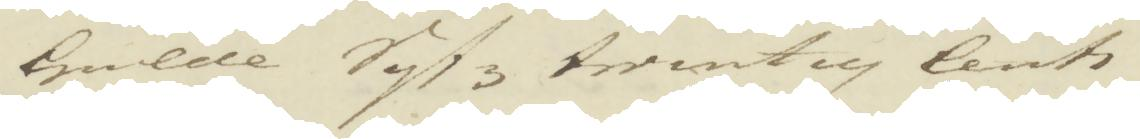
Gulde Vyf en twintig Cents
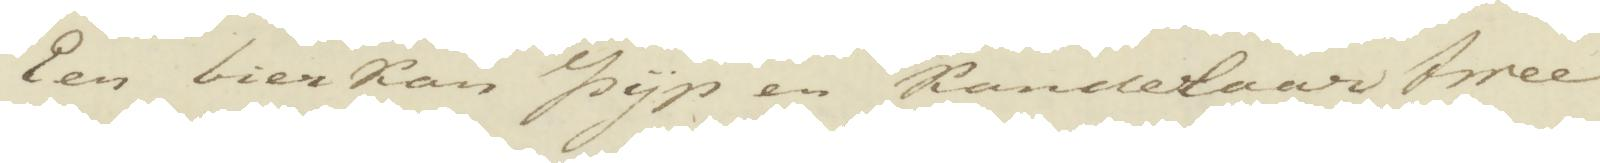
Een bierkan Pijp en kandelaar twee
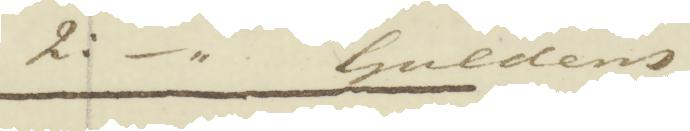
2:—„ Guldens
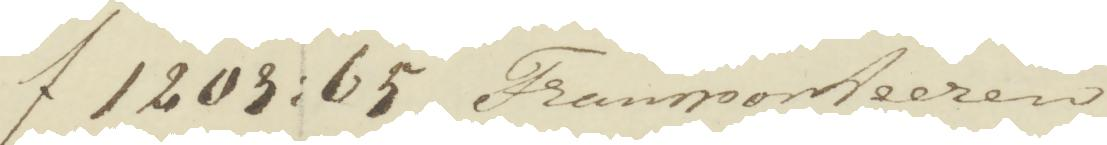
ƒ 1203:65 Transporteeren
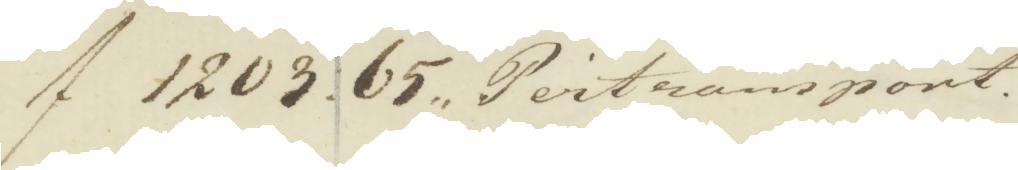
ƒ 1203.65„ Pertransport.
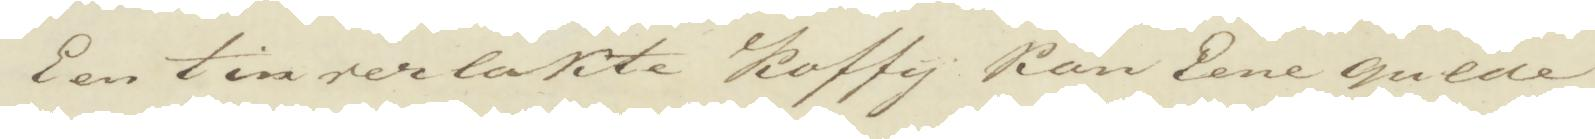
Een tin verlakte Koffy kan Eene gulde
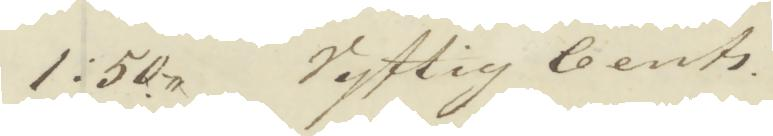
1:50„ Vyftig Cents
